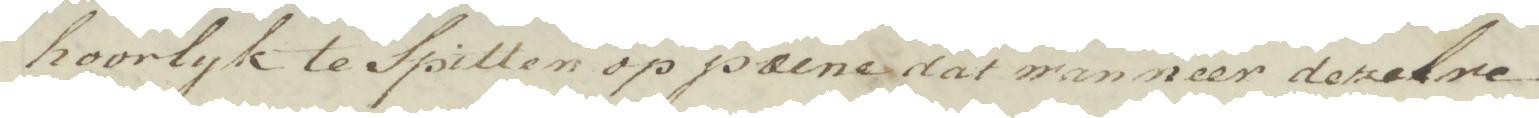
hoorlyk te spitten op peene dat wanneer dezelve
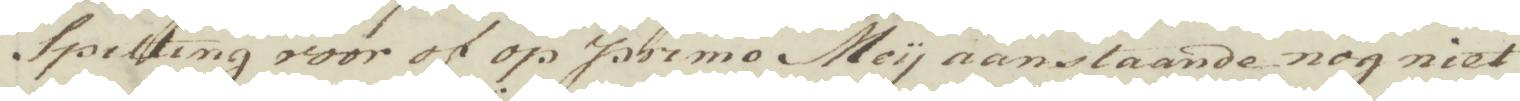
spitting voor of op primo Meij aanstaande nog niet
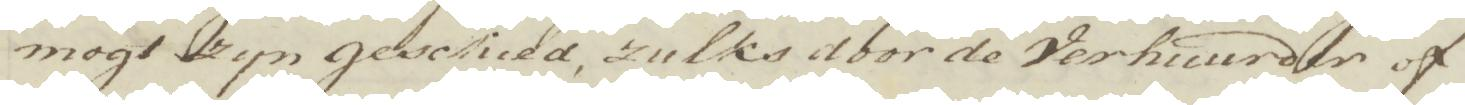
mogt zyn geschied, zulks door de Verhuurder of
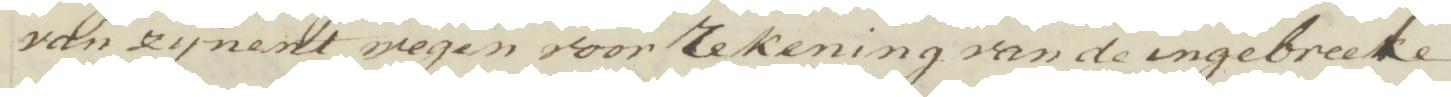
van zynent wegen voor rekening van de ingebreeke
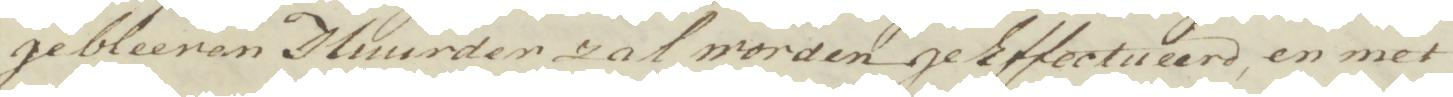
gebleeven Huurder zal worden geEffectueerd, en met
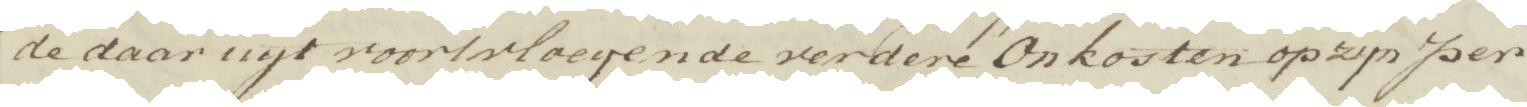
de daar uyt voortvloeyende verdere Onkosten op zyn per
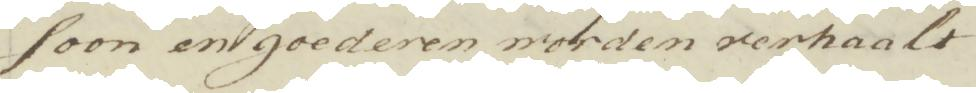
soon en goederen worden verhaalt
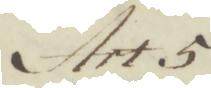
Art 5
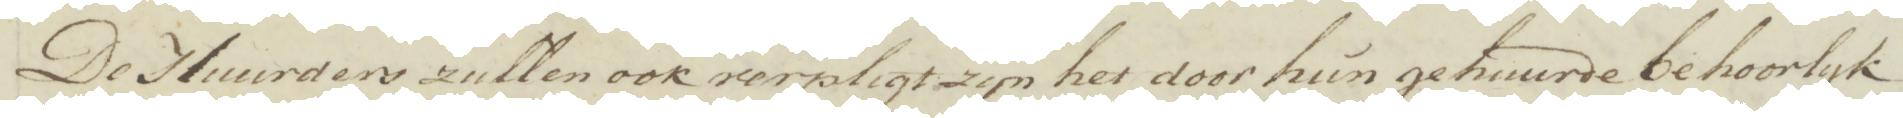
De Huurders zullen ook verpligt zyn het door hun gehuurde behoorlyk
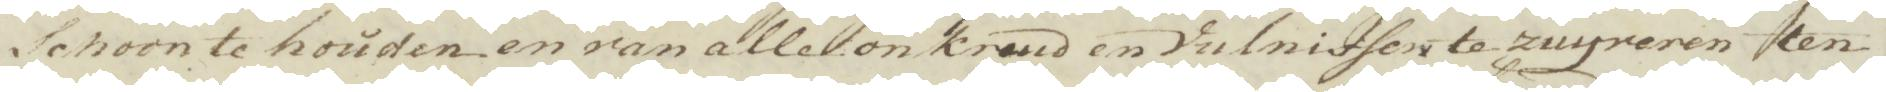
schoon te houden en van alle onkruid en Vulnissen te zuyveren ten
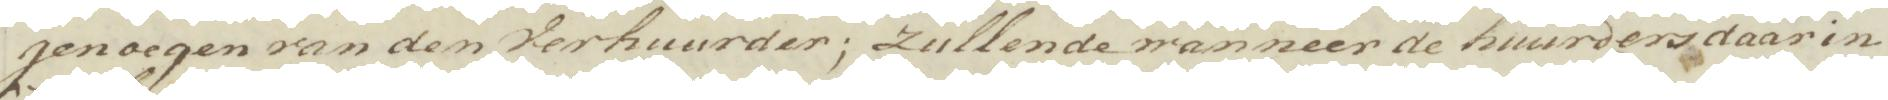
genoegen van den verhuurder; zullende wanneer de huurder daar in
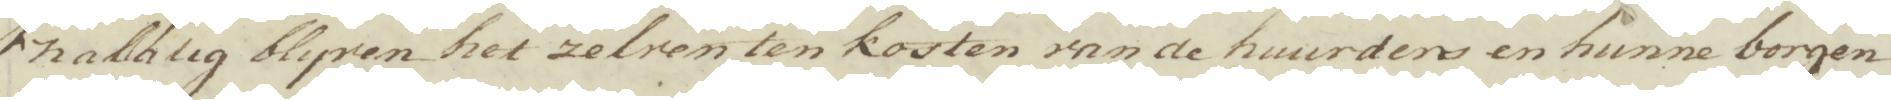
nalatig blyven het zelven ten kosten van de huurders en hunne borgen
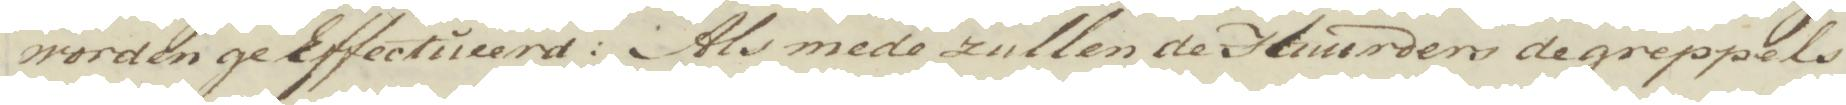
worden geEffectueerd: Als mede zullen de Huurders de greppels
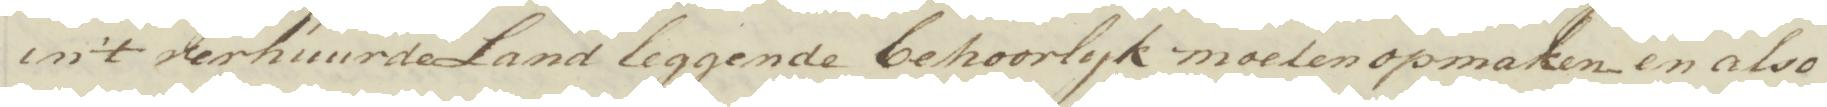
in’t verhuurde Land leggende behoorlyk moeten opmaken en also
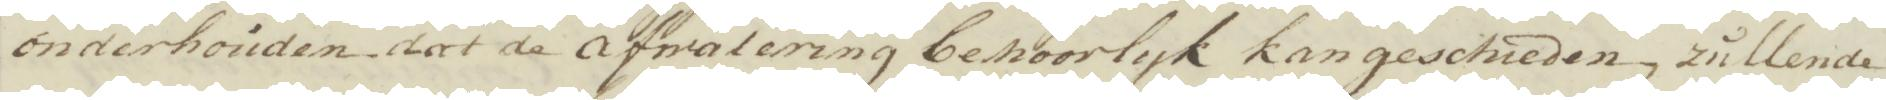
onderhouden dat de afwatering behoorlyk kan geschieden, zullende
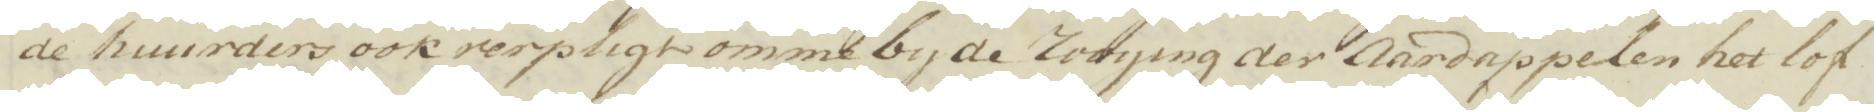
de huurders ook verpligt omme by de rooying der Aardappelen het lof
